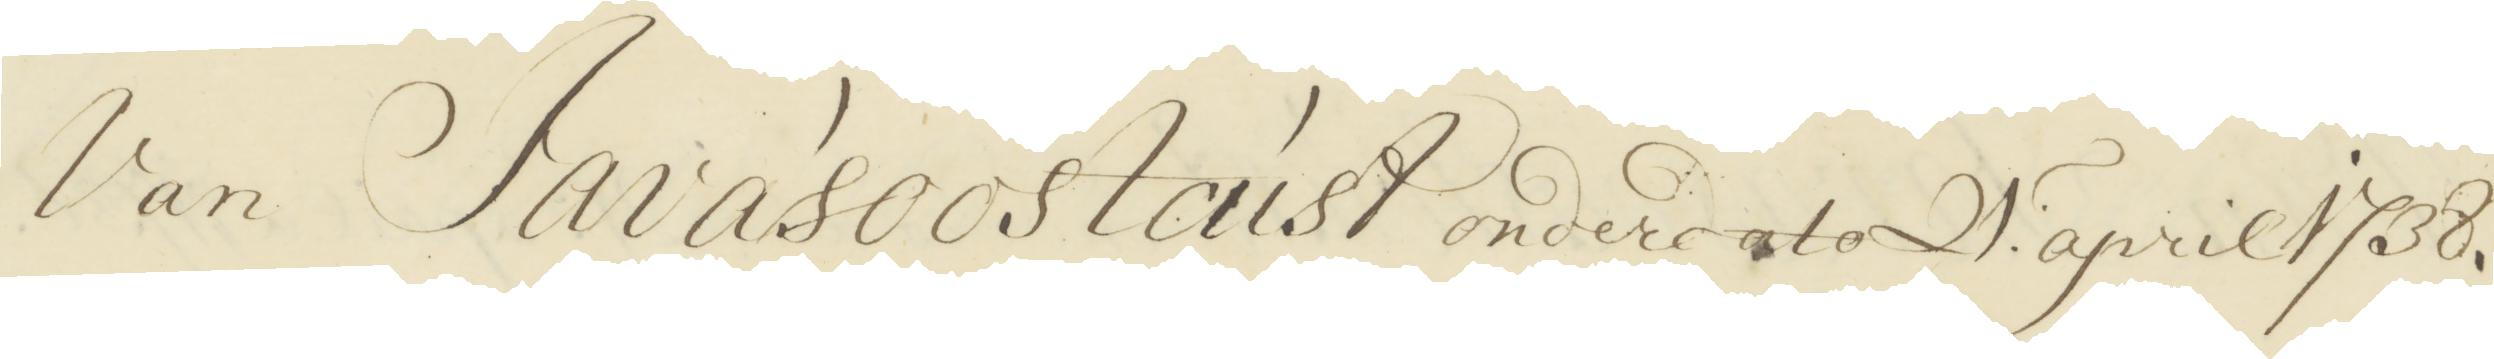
Van Iava'soostcust onder dato 21:' april 1738.
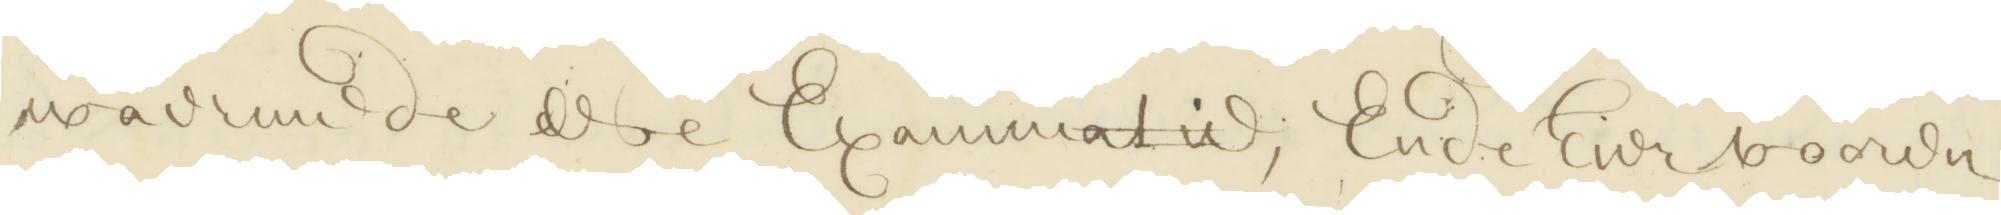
waermede dese Examinatie, Ende hier vooren
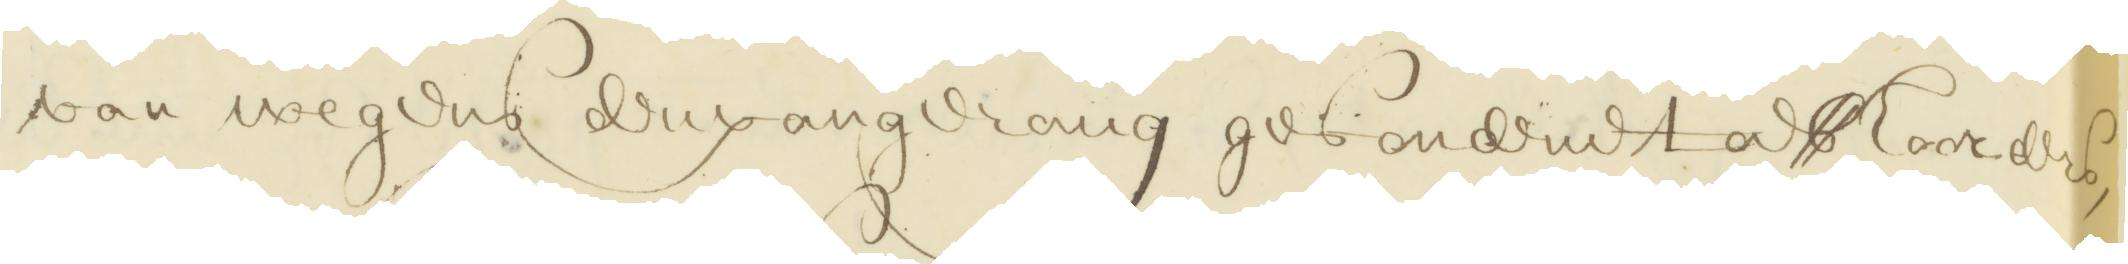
van wegens den pangerang gesondene toeshoorders,
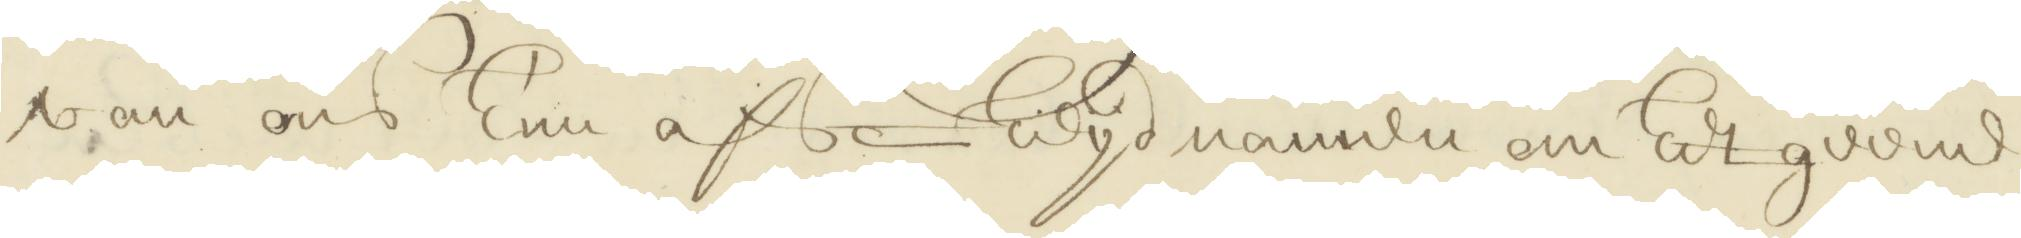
van ons hun afscheijd namen om het geene
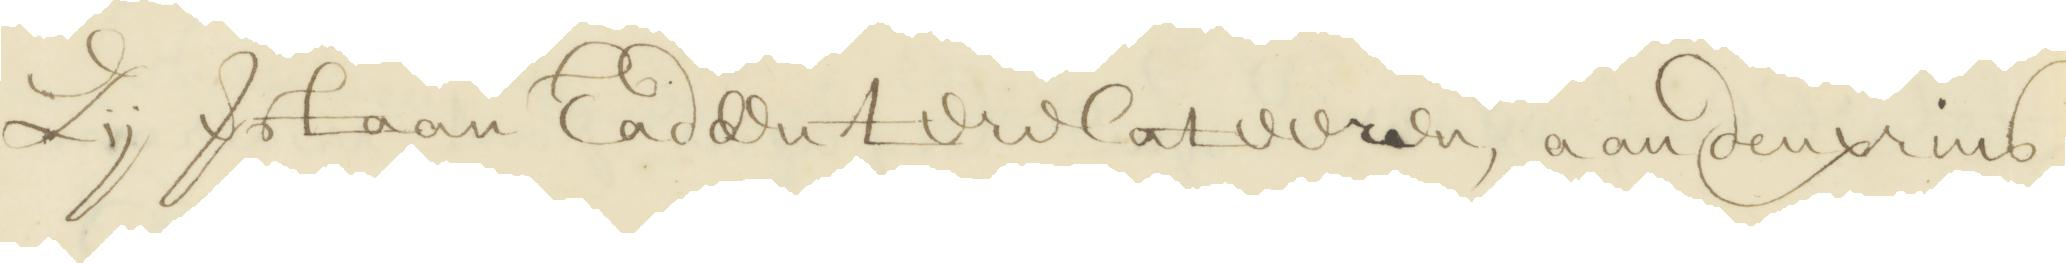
zij verstaan hadden terelateeren, aan den prins
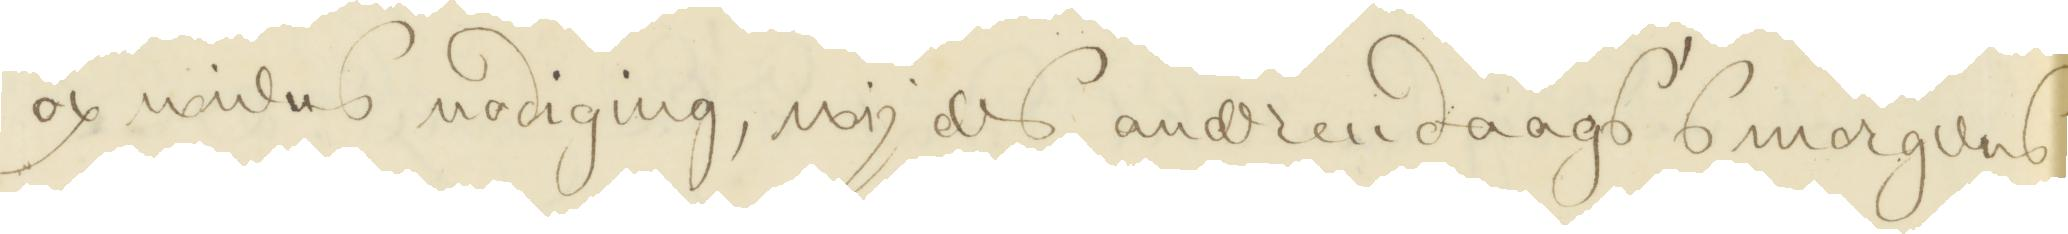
op wiens nodiging, wij des anderendaags 'smorgens
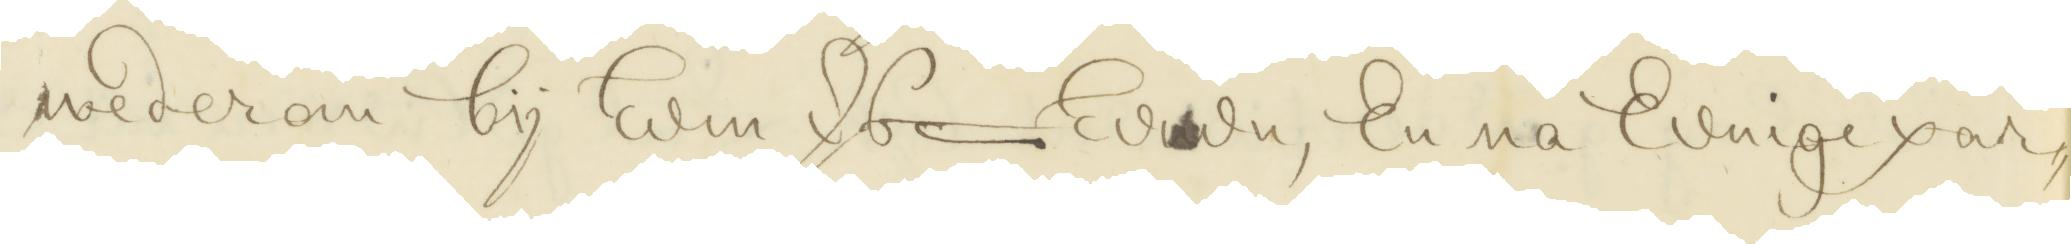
wederom bij hem verschenen, En na Eenige par„
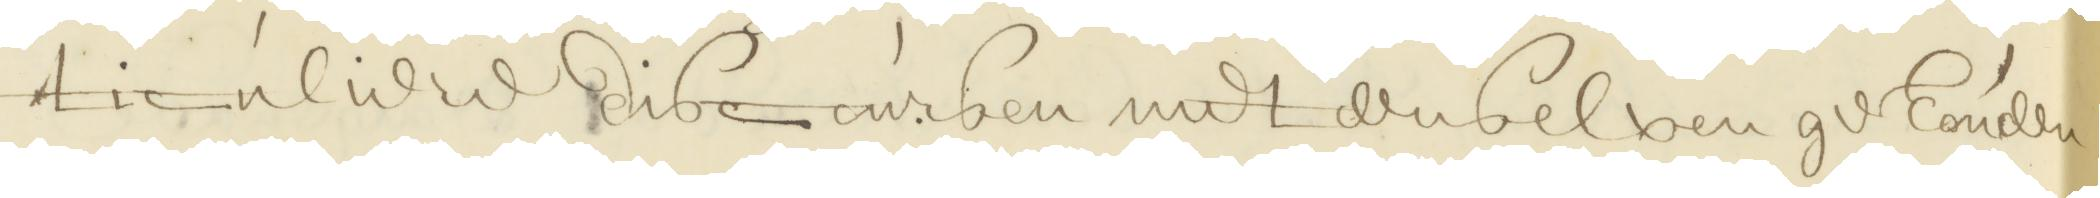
ticuliere discoursen met denselven gehouden
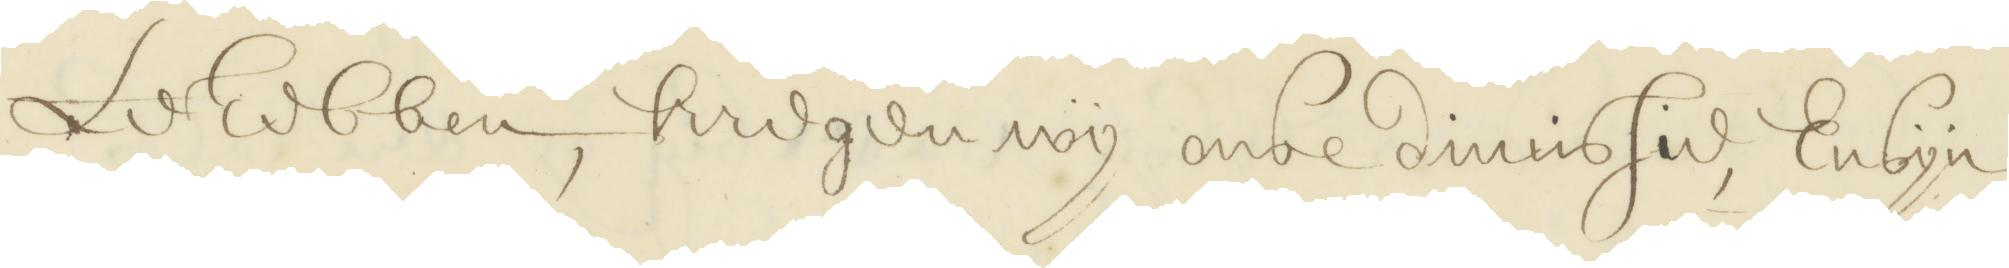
te hebben, kregen wij onse dimissie, En sijn
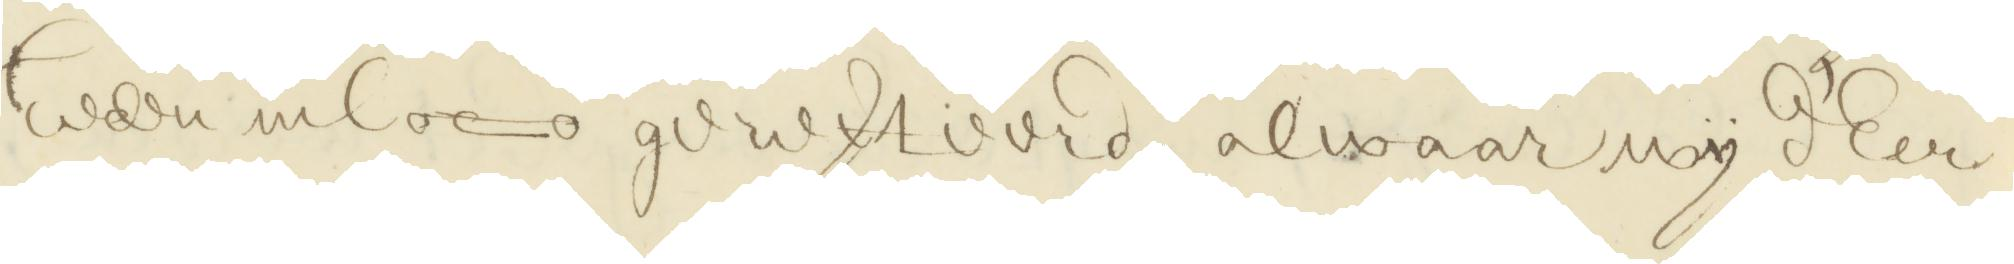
heden inloco gereverteerd, alwaar wij d'Eer
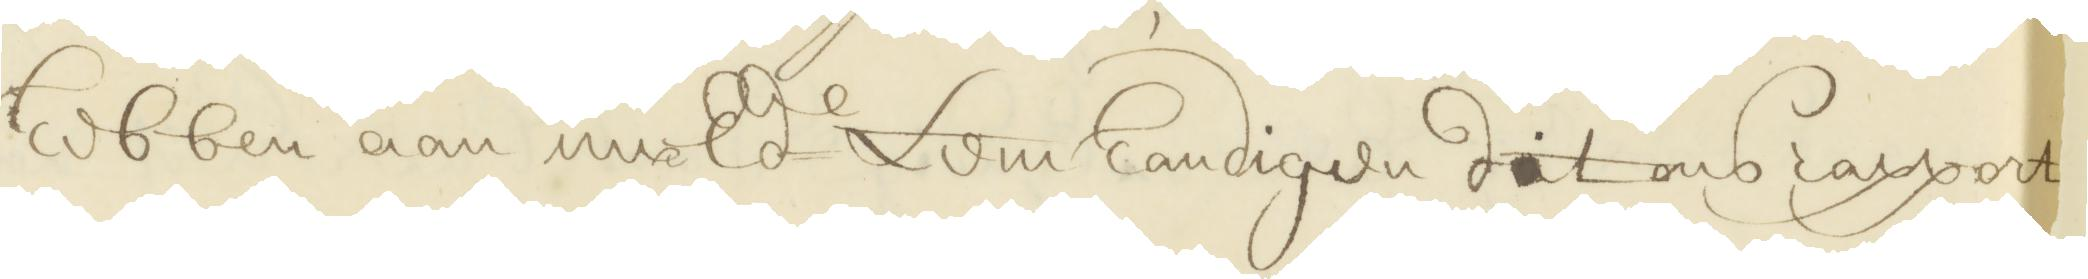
hebben aan uw Ed=e tem handigen dit ons rapport
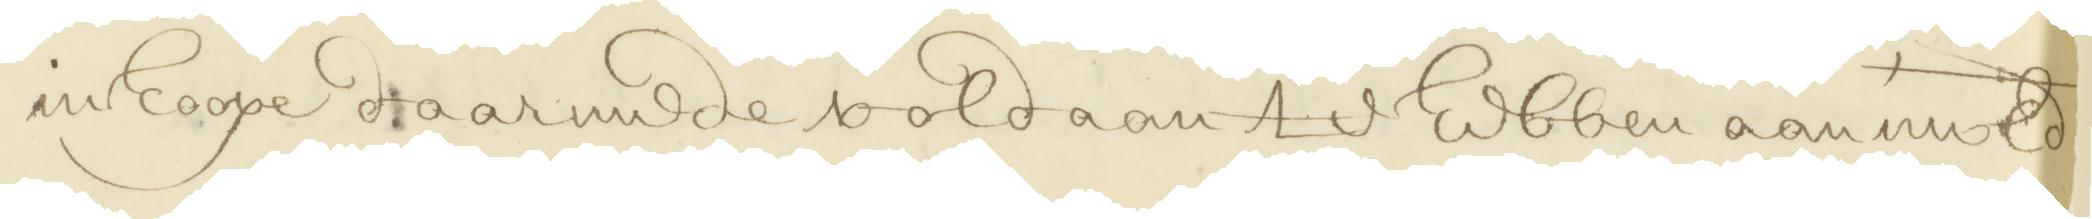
inhoope daarmede voldaan te hebben aan uw Ed
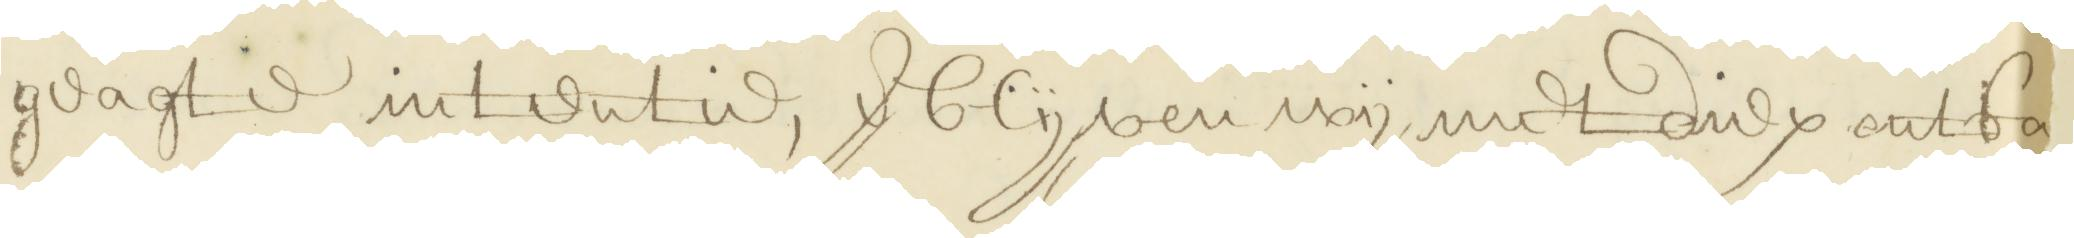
geagte intentie, verblijven wij met diep ontsa
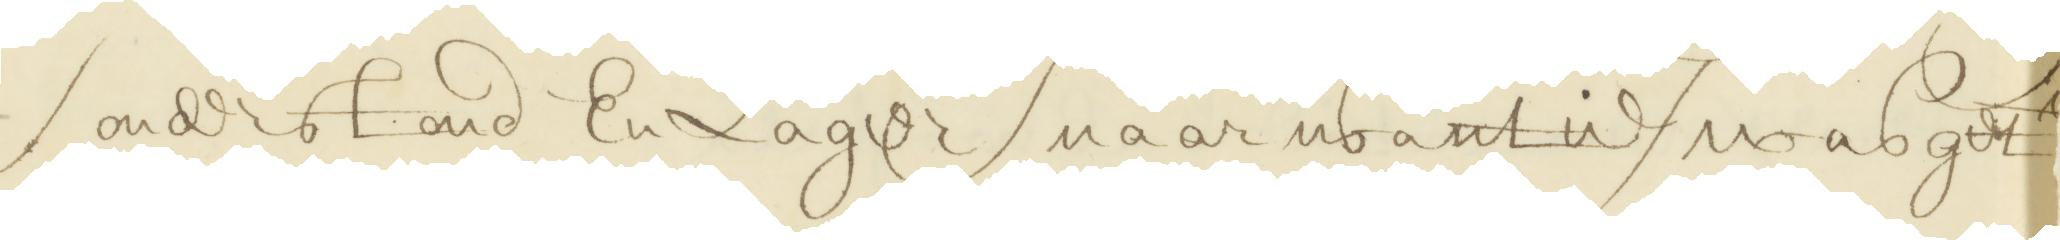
/onderstond En Lager/ naar usantie/ was get=t
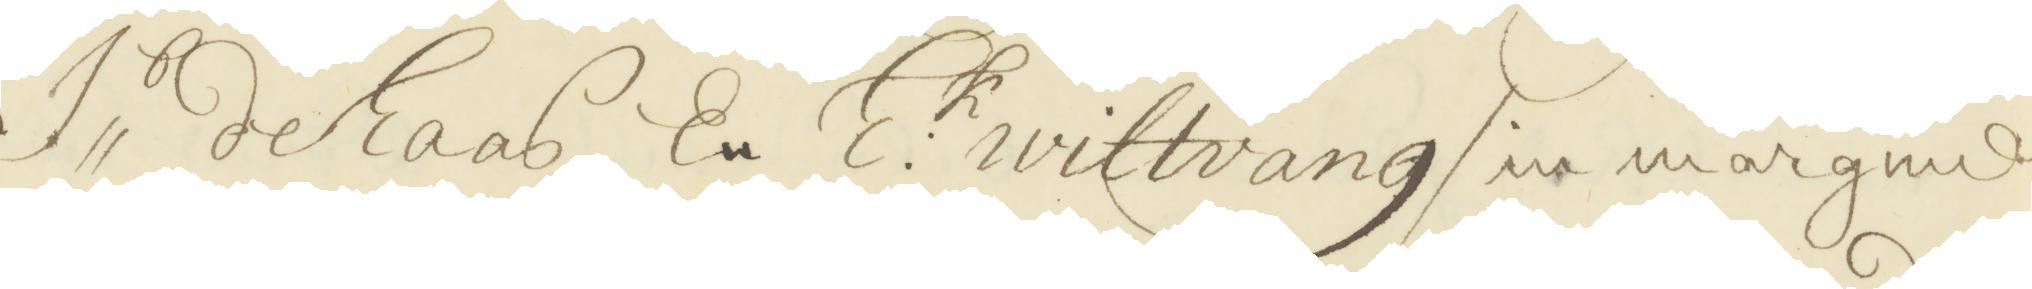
I„s de haas En E:k wiltvang /in margine
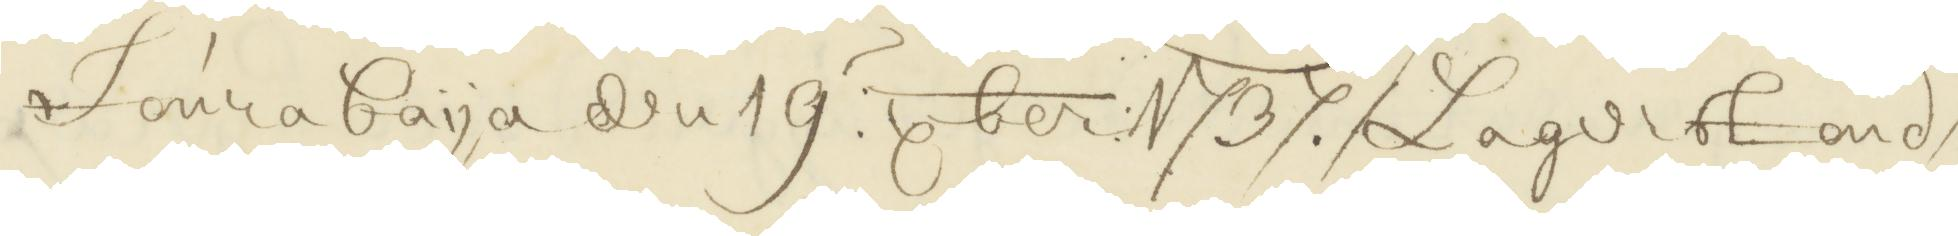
sourabaija den 19:' xber: 1737. /Lagerstond/
